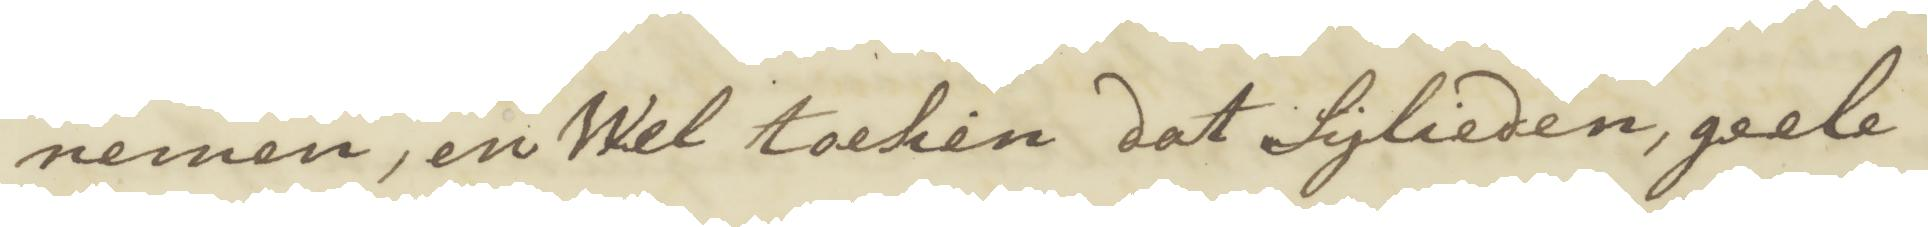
nemen, en Wel toeken dat sijlieden, geele
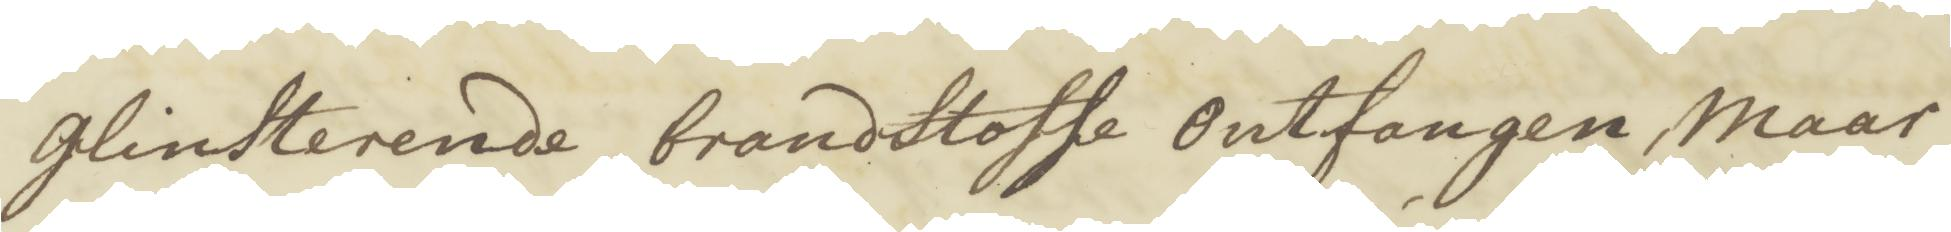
glinsterende brandstoffe ontfangen, maar
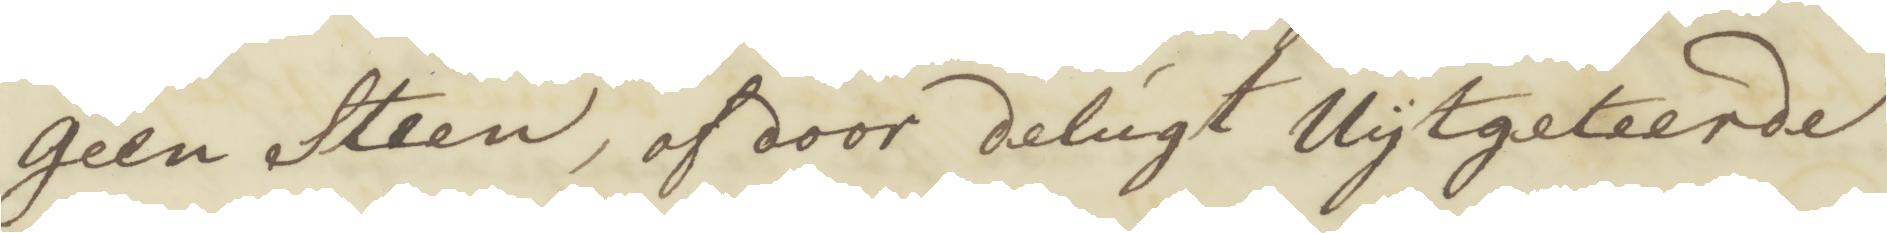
geen steen, of door delugt Uijtgeteerde
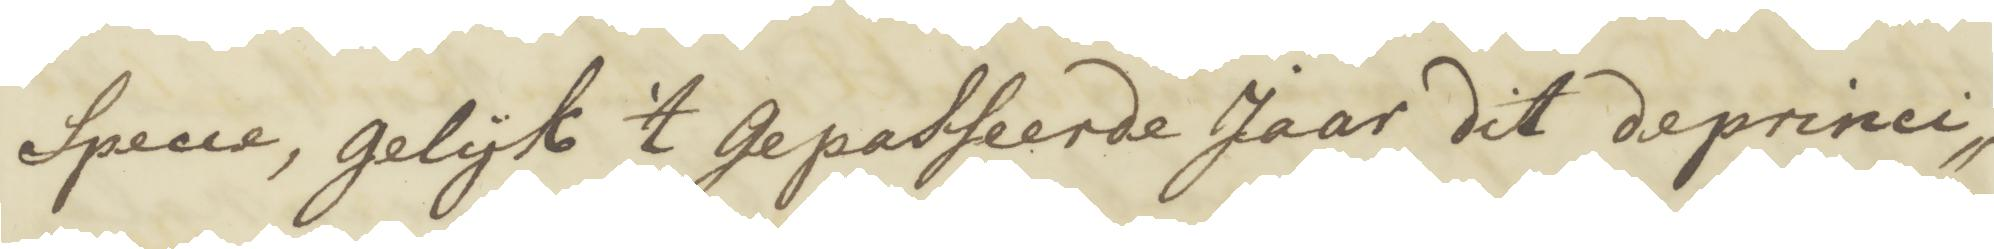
specie, gelijk ’t Gepasseerde Jaar dit deprinci„
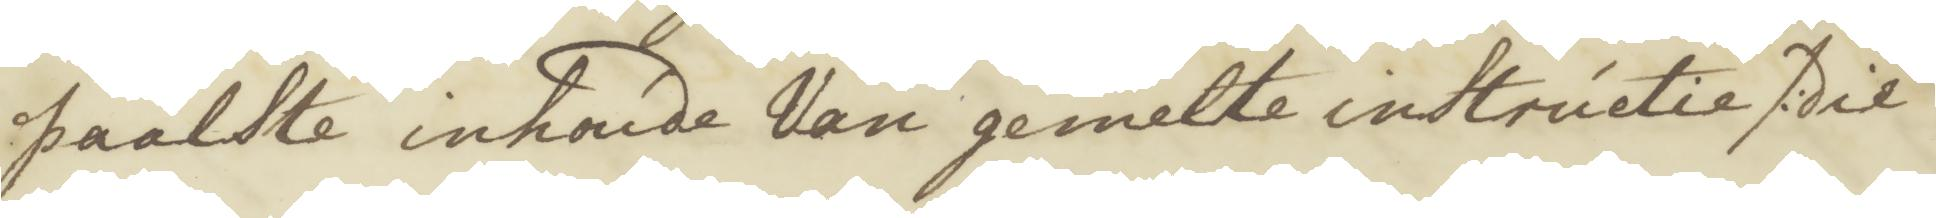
paalste inhoude Van gemelte instructie /:die
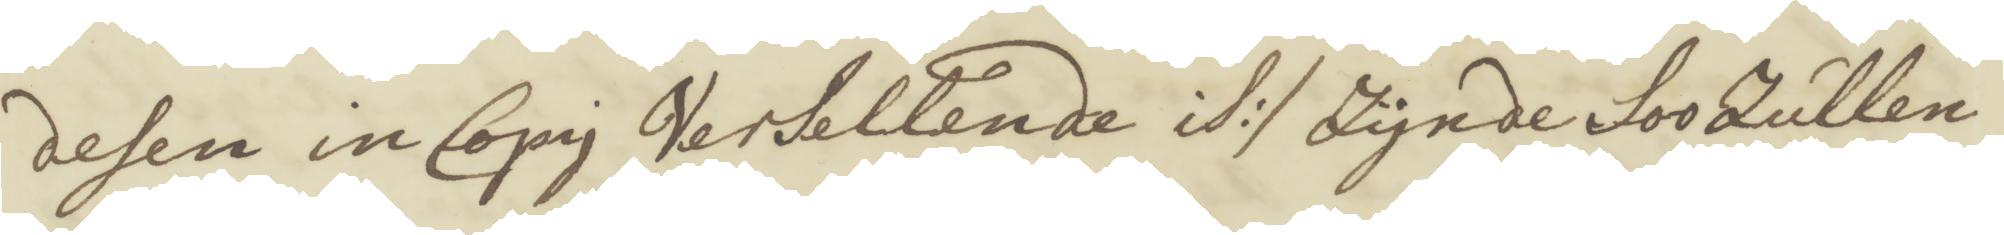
desen in Copij Versellende is:/ zijnde soo zullen
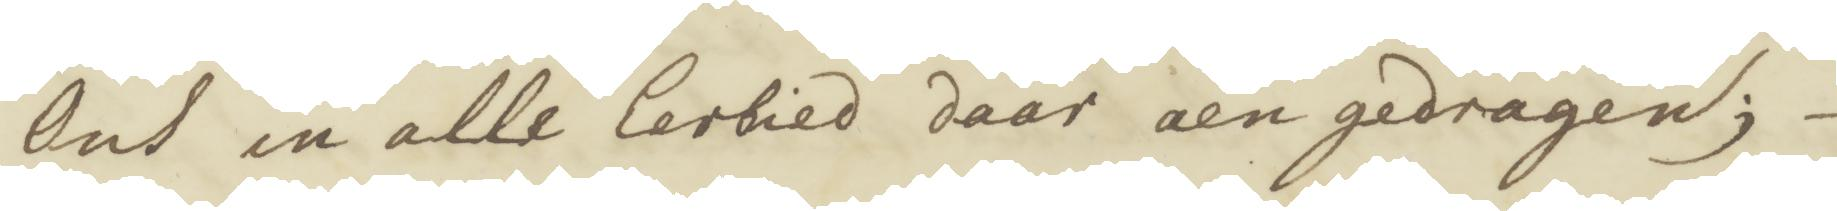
Ons in alle Eerbied daar aen gedragen; —
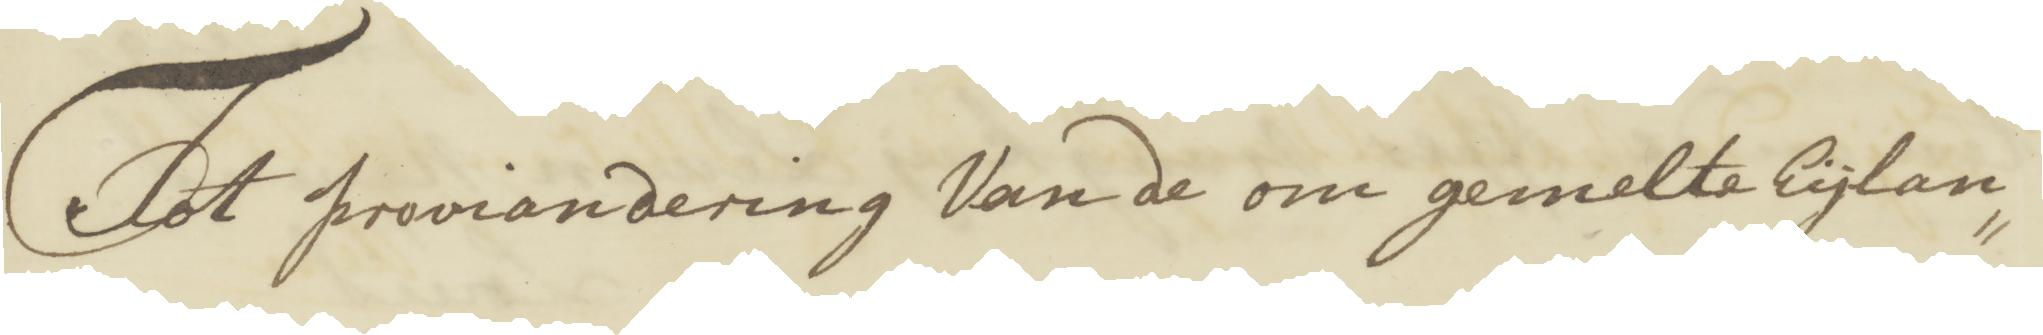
Tot proviandering Van de om gemelte Eijlan„
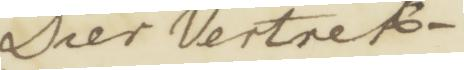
Dier Vertrek —
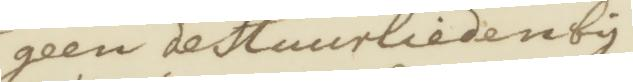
't geen de stuurlieden bij
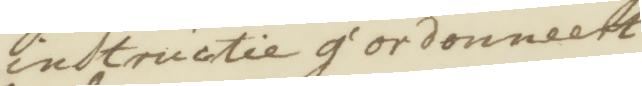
instructie g’ordonneert
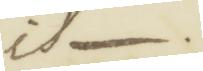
is —.
